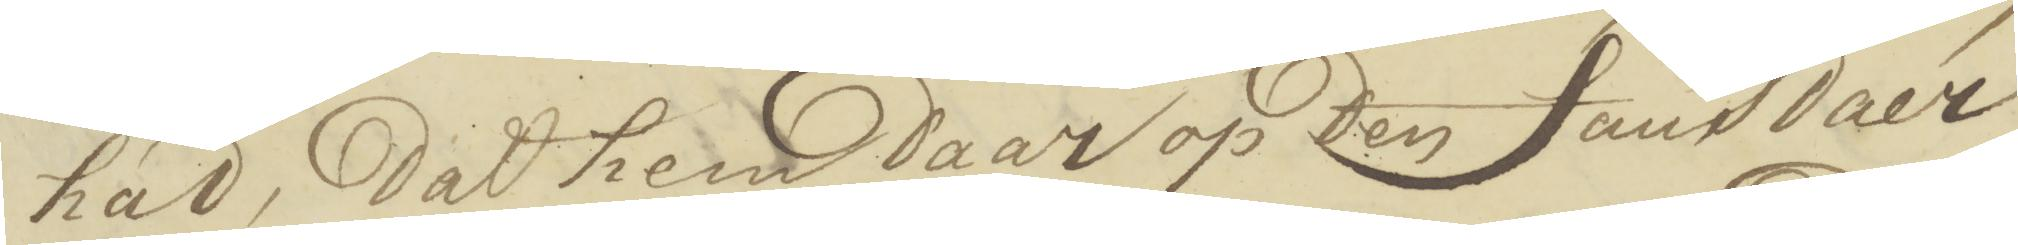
had, dat hem daar op den Sausdaer
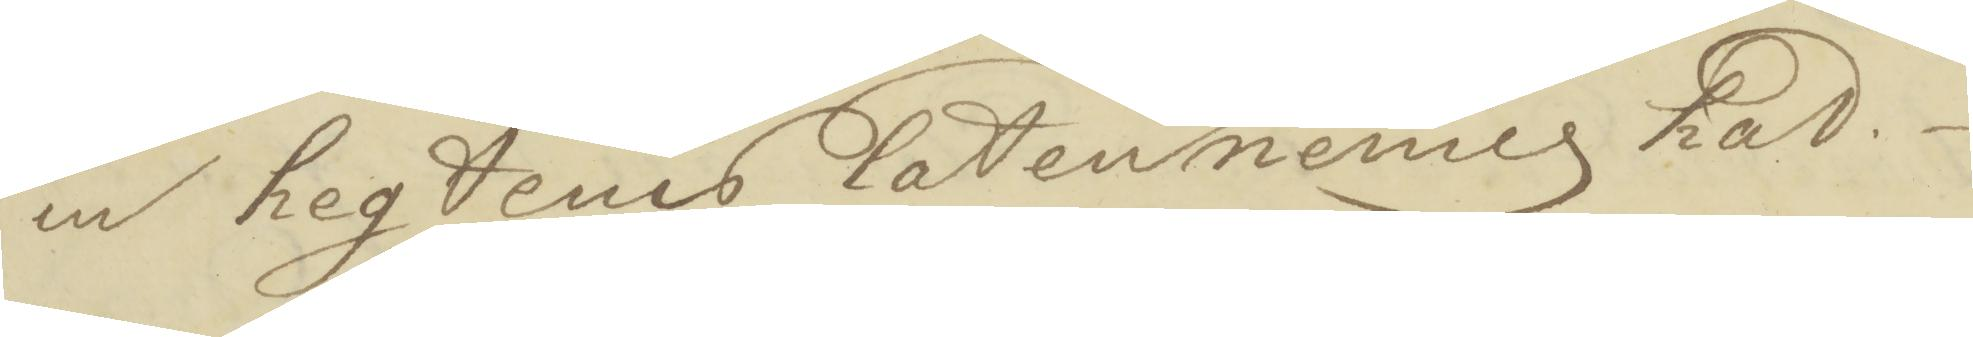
in hegtenis laten nemen had.-
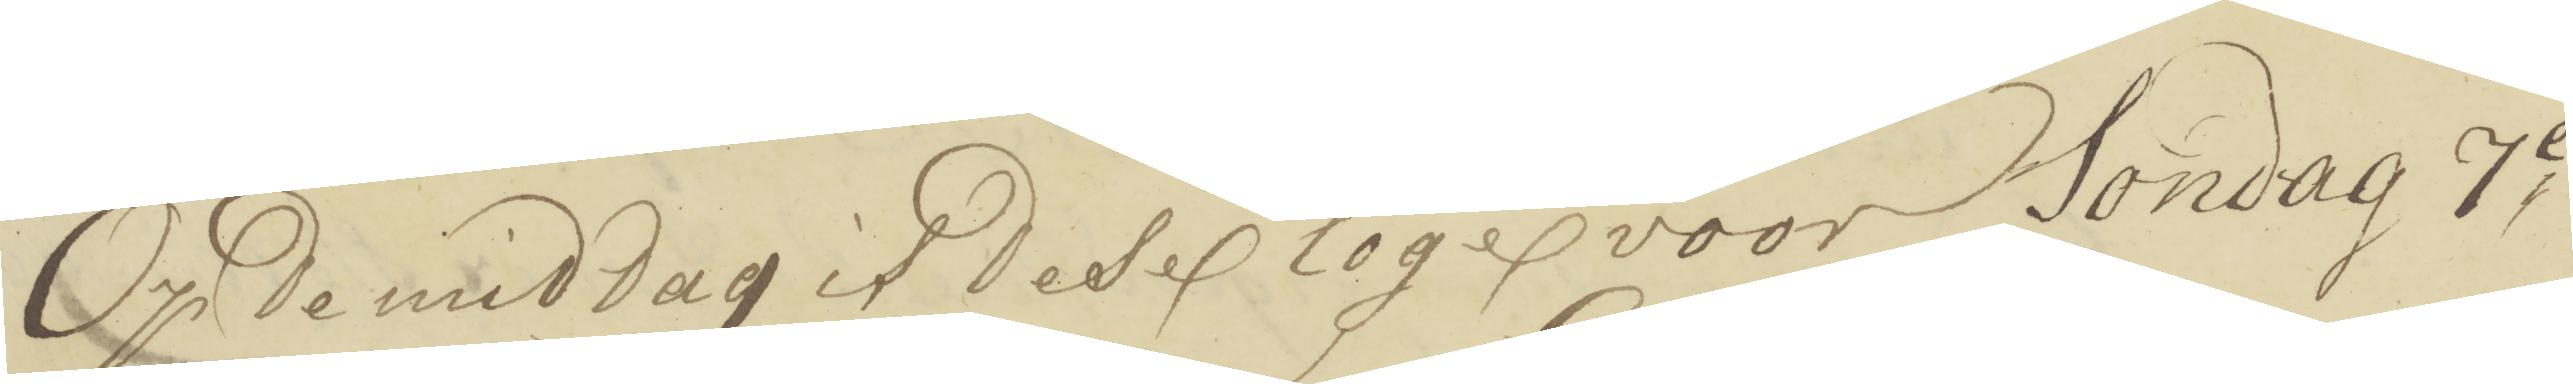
Op de middag is dese loge voor sondag 7„e
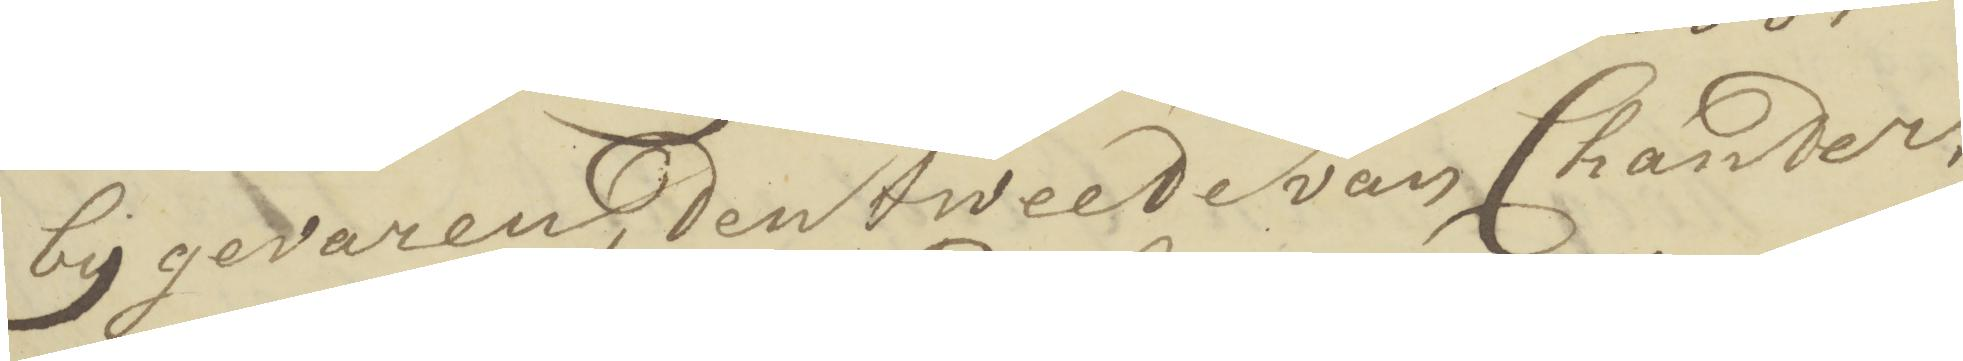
bij gevaren, den tweede van Chander„
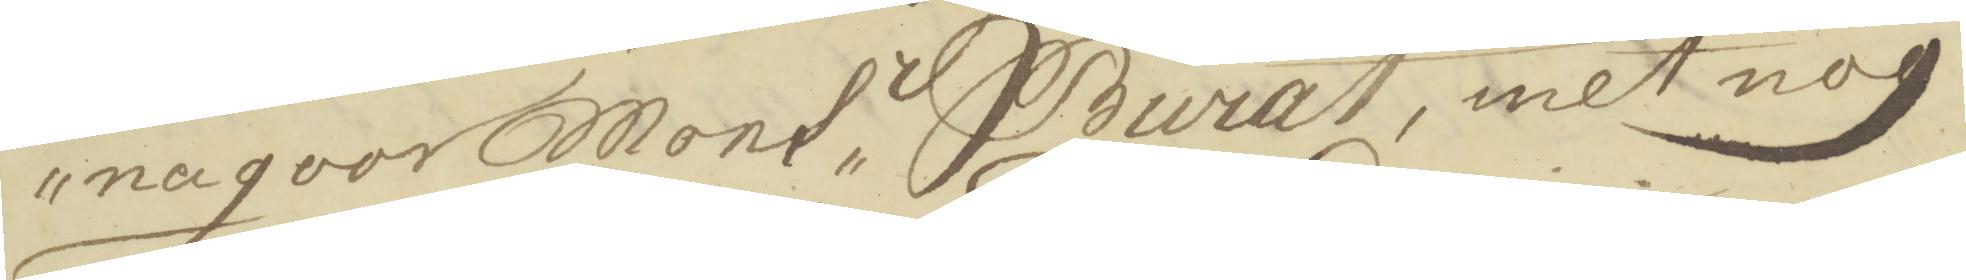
„nagoor Mons„r Burat, met nog
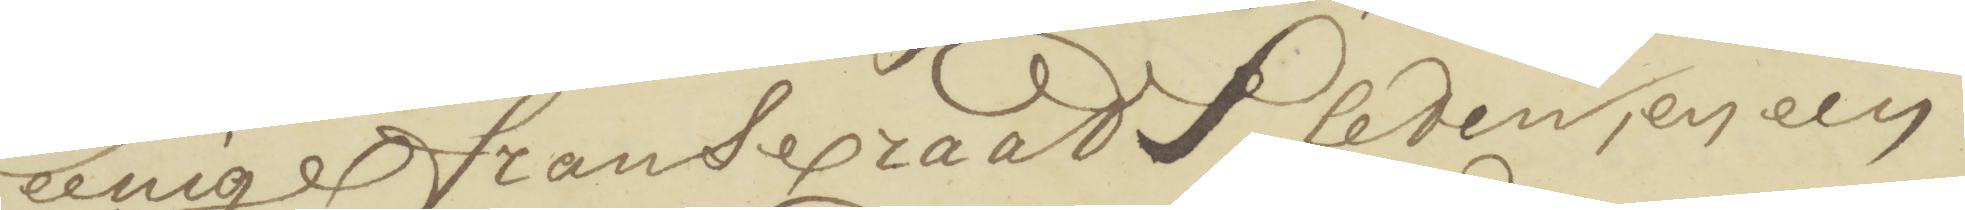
eenige franse raads leden, en een
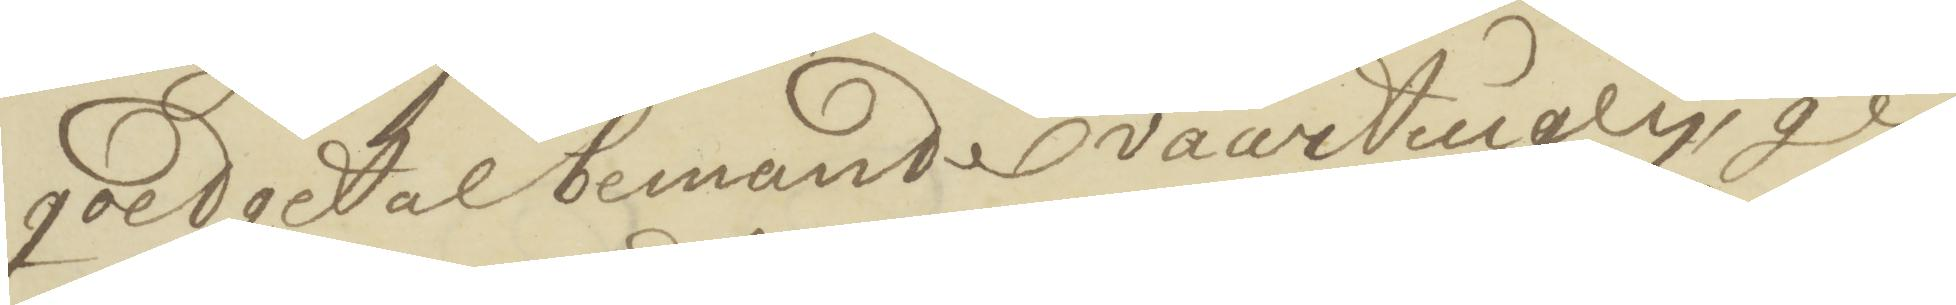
goed getal bemande vaartuigen ge
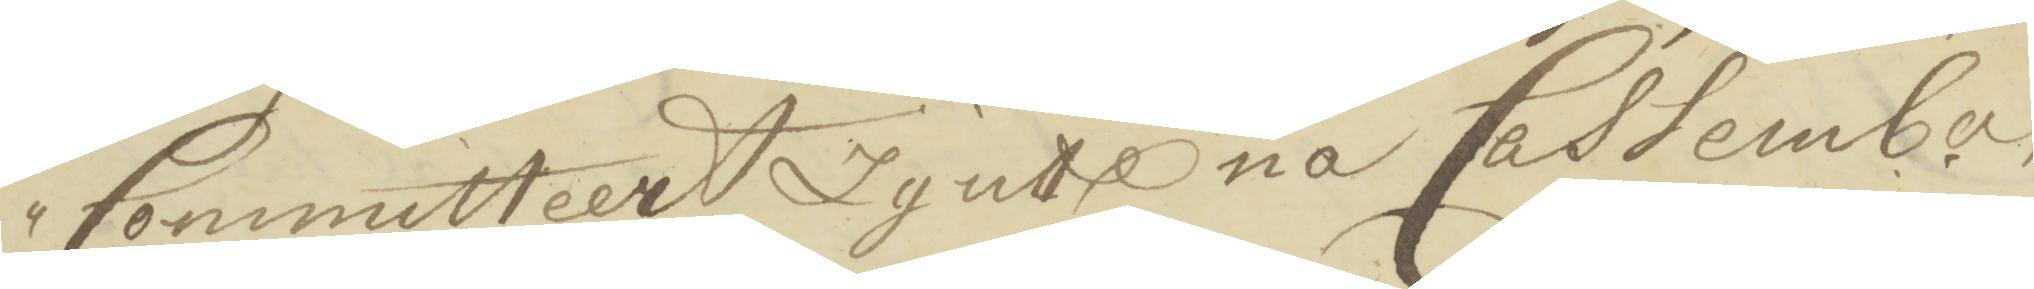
„Committeert zijnde na Cassemba
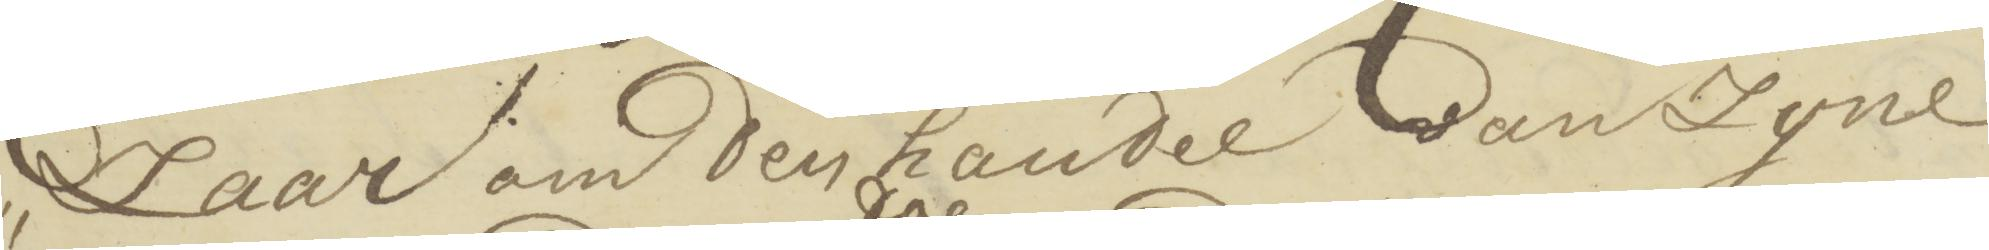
„Zaar om den handel van Zyne
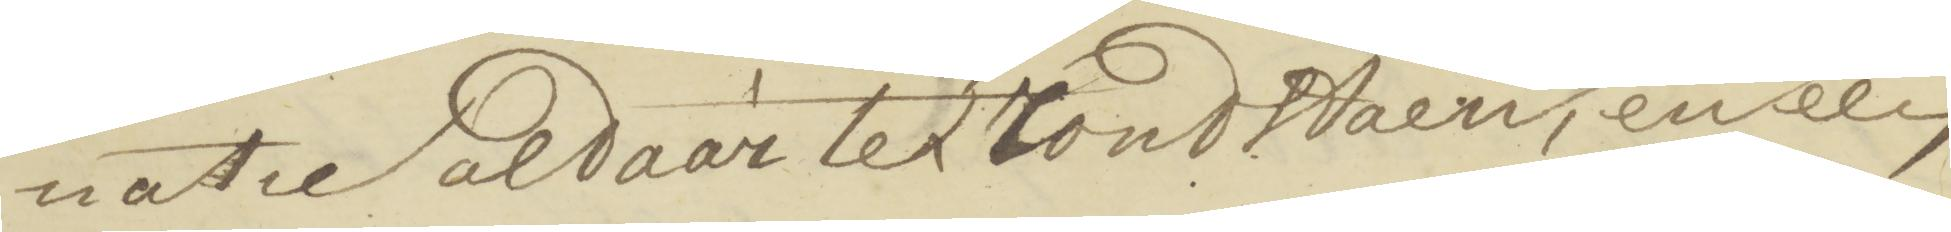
natie aldaar te ^ rond staen, en een
